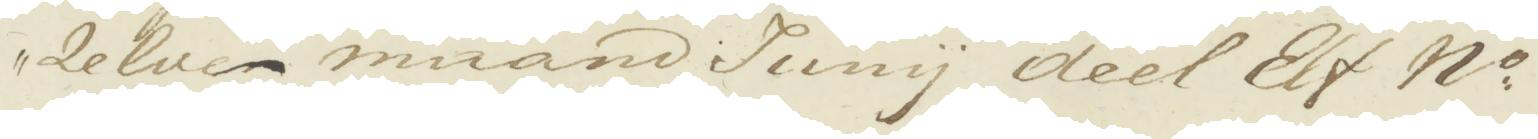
„zelver maand Junij deel Elf N:o
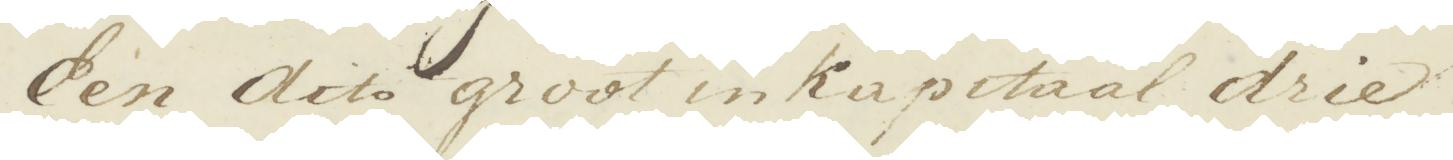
Een dito groot in kapitaal drie
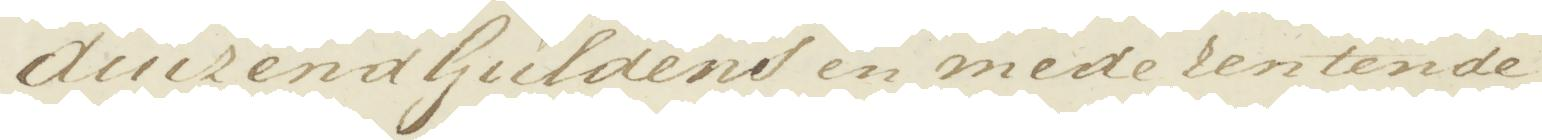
duizend Guldens en mede rentende
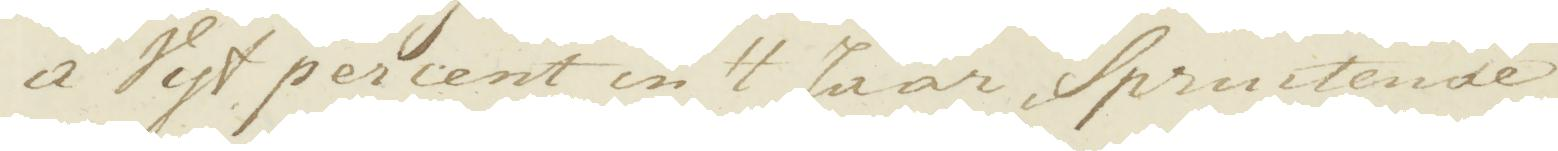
a Vyf percent in ’t Jaar Spruitende
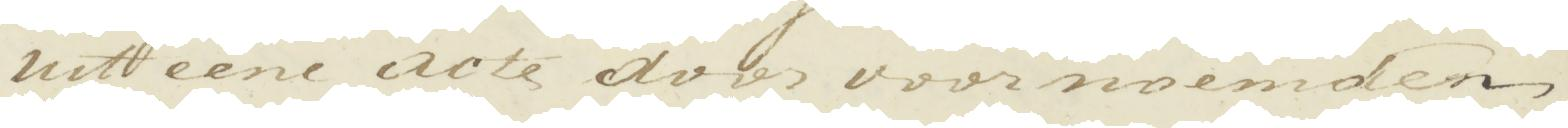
uit eene acte door voornoemden
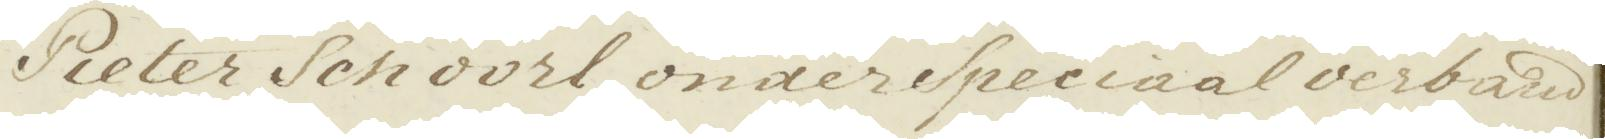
Pieter Schoorl, onder speciaal verband
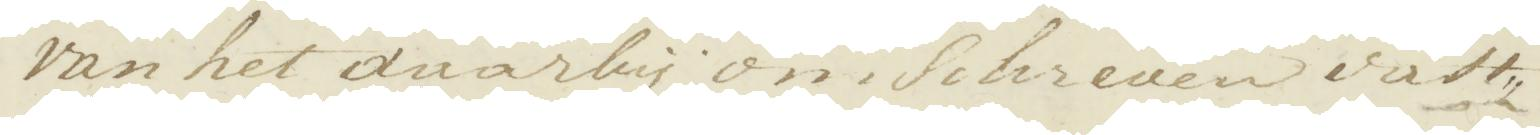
van het daarbij omschreven vast„
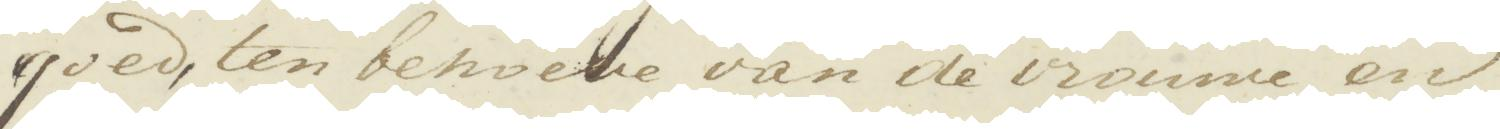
„goed, ten behoeve van de vrouwe en
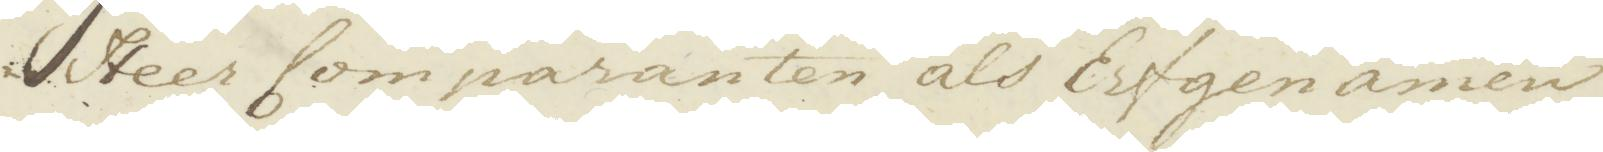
Heer Comparanten als Erfgenamen
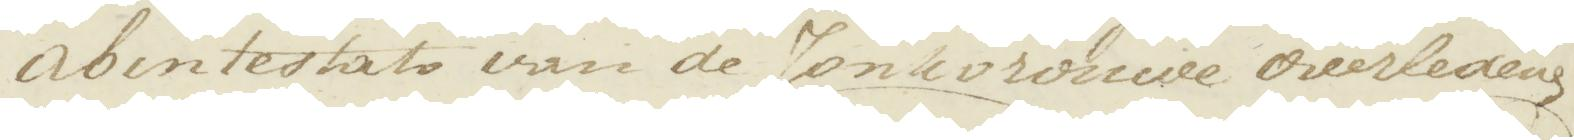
ab intestato van de Jonkvrouwe overledenen
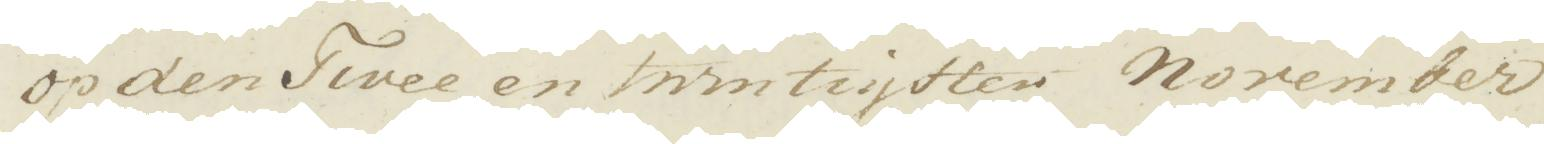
op den Twee en twintigsten november
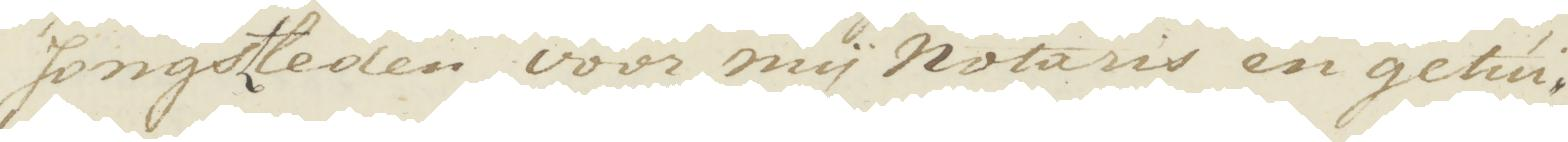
Jongstleden voor mij notaris en getui„
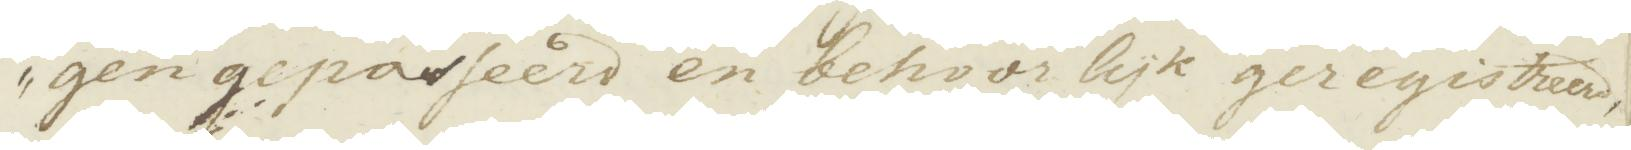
„gen gepasseerd en behoorlijk geregistreerd,
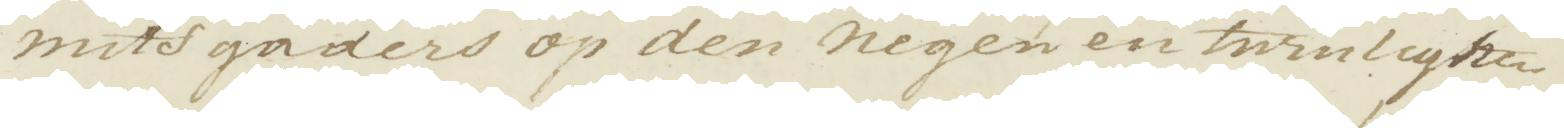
mitsgaders op den negen en twintigsten
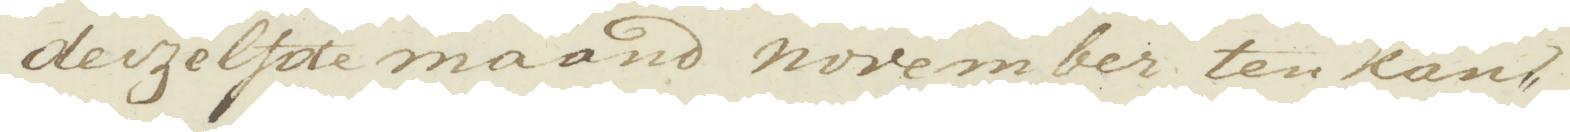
derzelfde maand november ten kan„
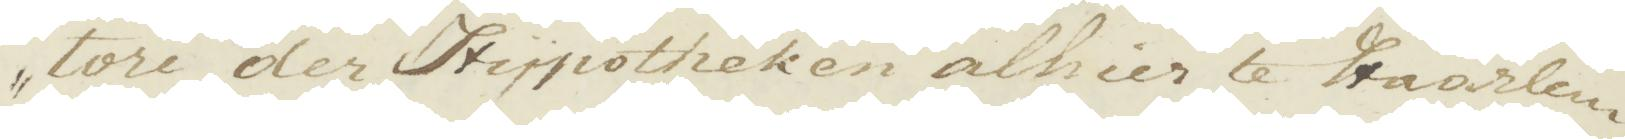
„tore der Hijpotheken alhier te Haarlem
